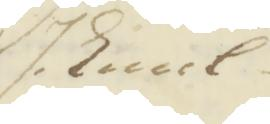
J. Evert
